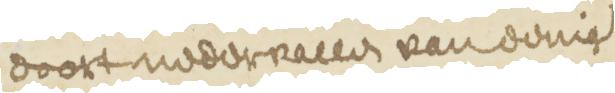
doort neder vallen van eenige
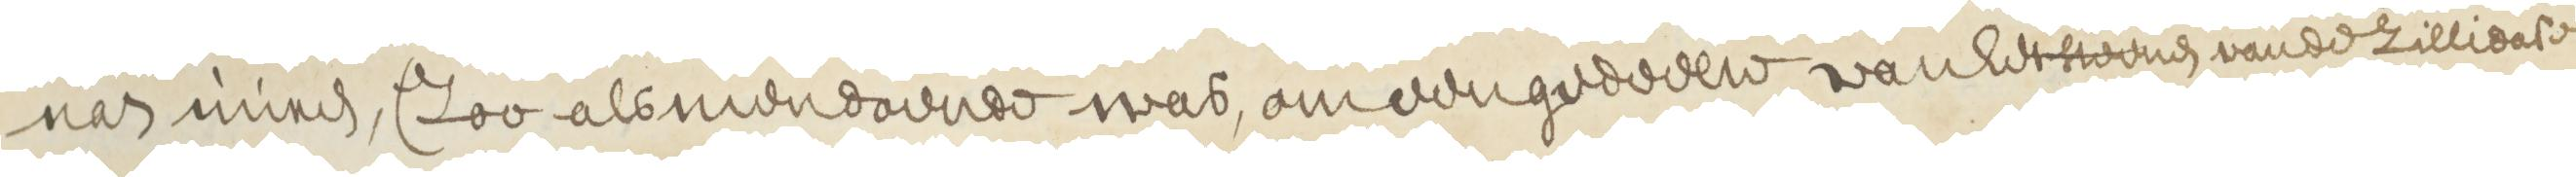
na 7 uuren, (Zoo als men doende was, om een gedeelte van het steenen van de zillidase
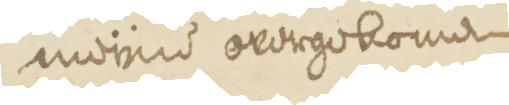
meijne overgekomen
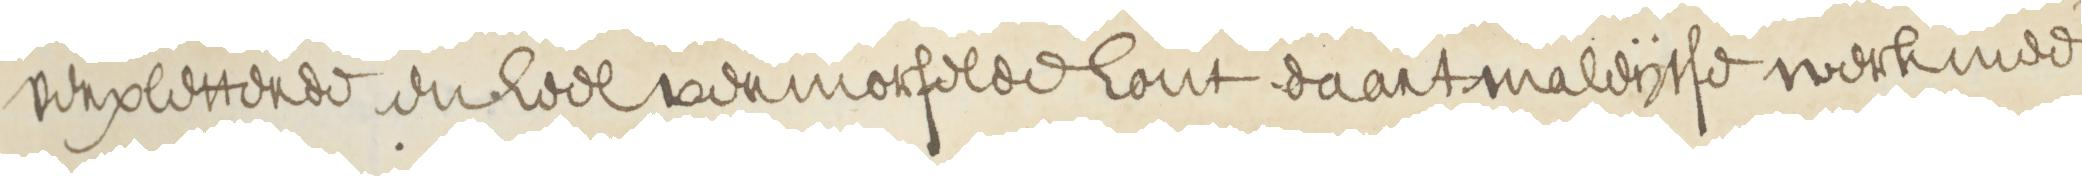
verpletterde en heel vermorselde hout daar 't maleijtse werk mee
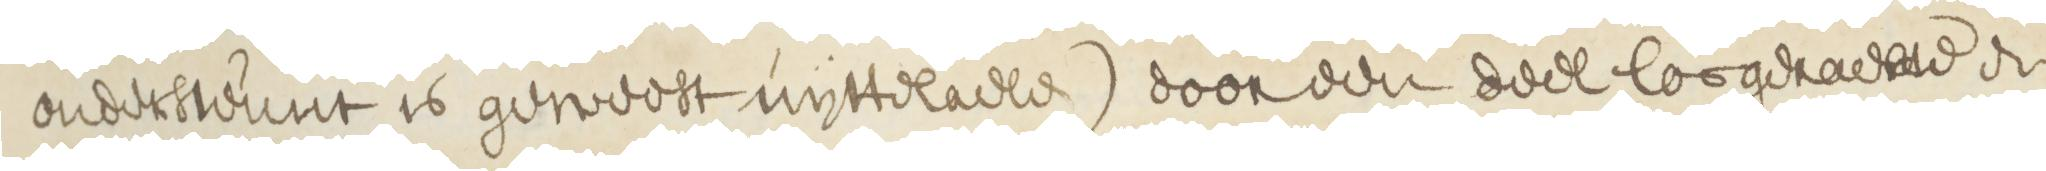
ondersteunt is geweest uijt te haelen) door een deel los geraekte en
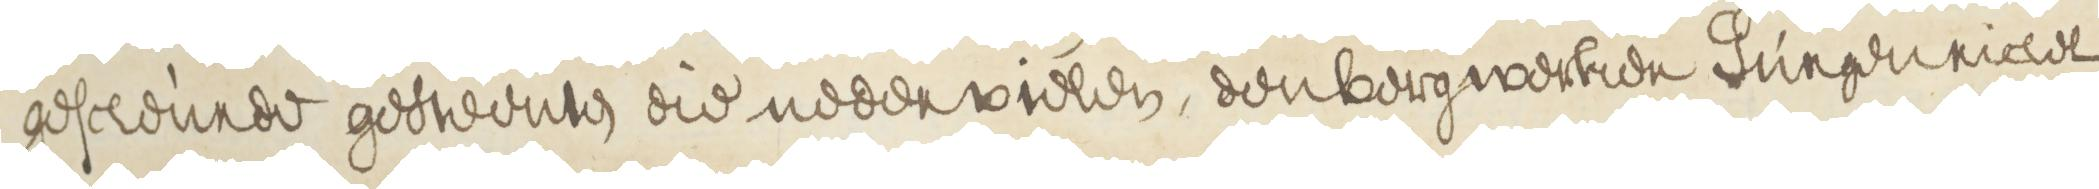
gescheurde gesteenten die neder vielen, den bergwerker Iurgen richel
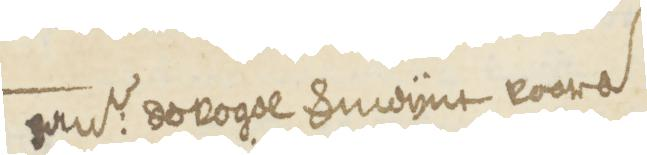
gem:e de vogel vermeijnt voorde
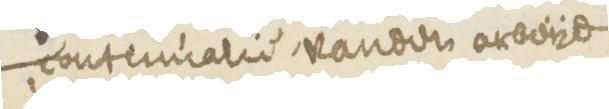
continuatie van den arbeijd
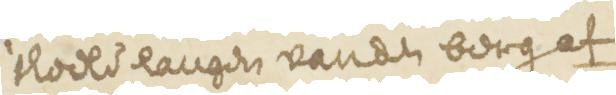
't heele hangen van den berg af
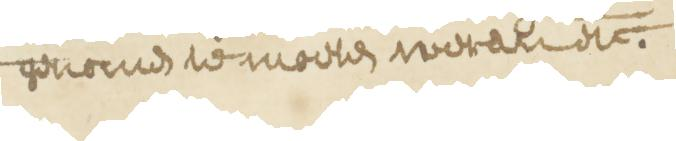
genomen te moeten werden etc.
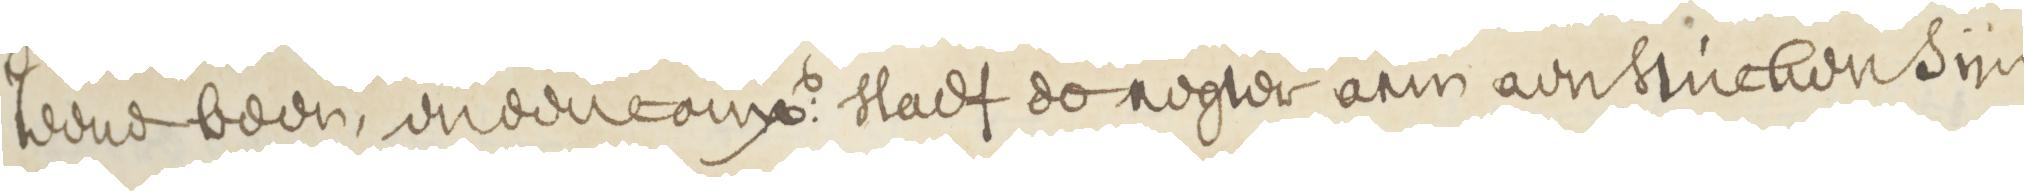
't eene been, en den comp:s slaef de regter arm aen stucken sijn
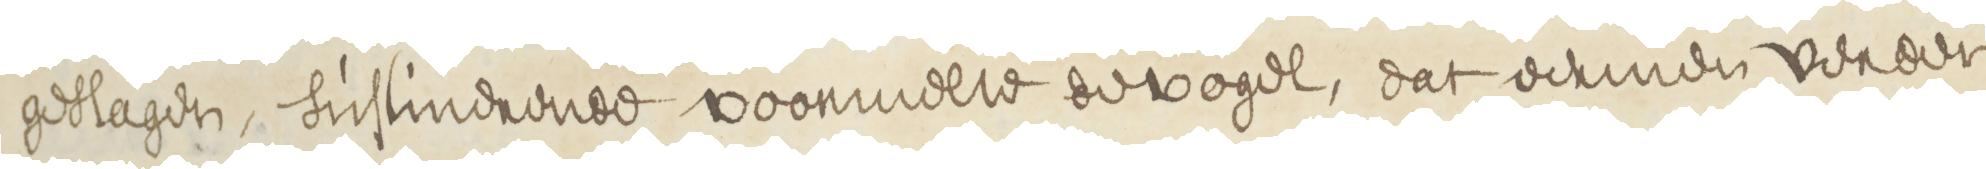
geslagen, sustinerende voormelte de vogel, dat eer men verder
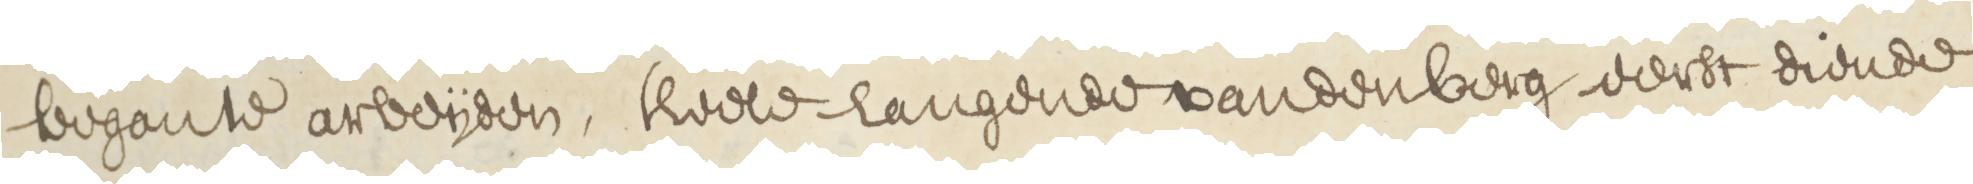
begon te arbeijden, theele hangende van den berg eerst diende
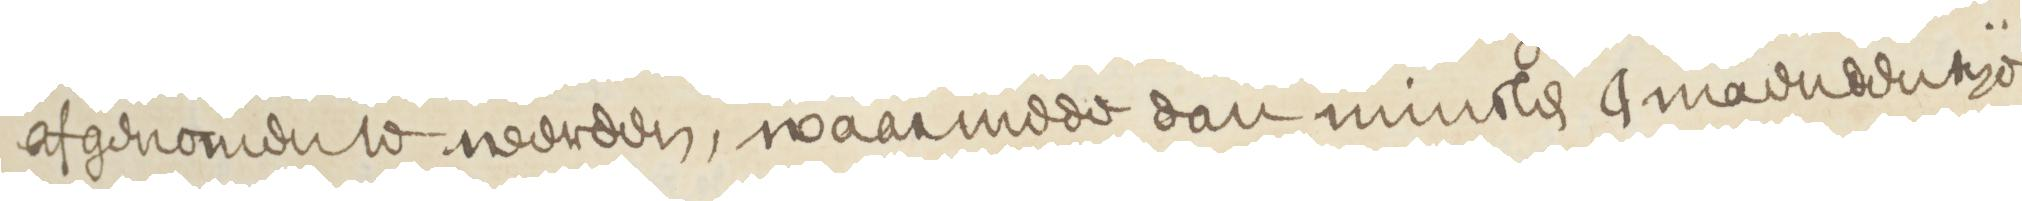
afgenomen te werden, waarmede dan minsten 4 maenden tijd
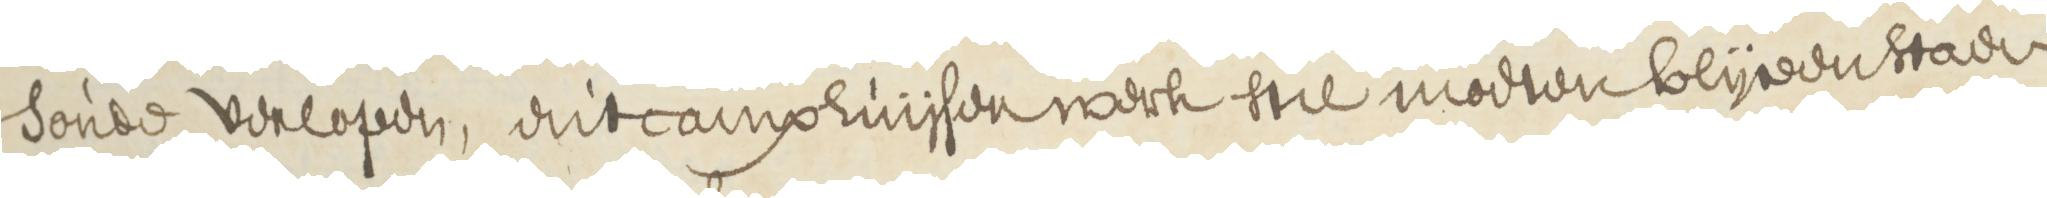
soude verlopen, en ’t camphuijser werk stil moeten blijven staen
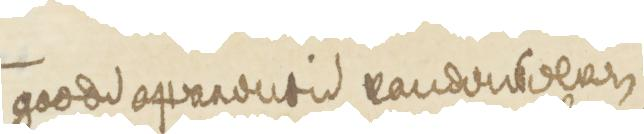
goede apparentie van den selven
